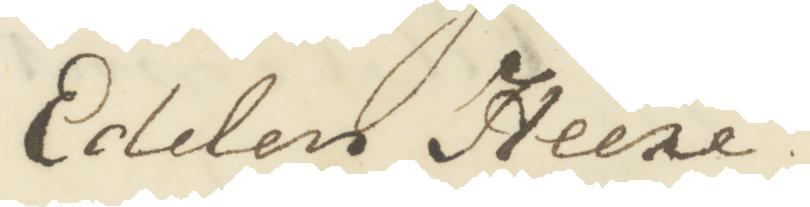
Edelen Heere:
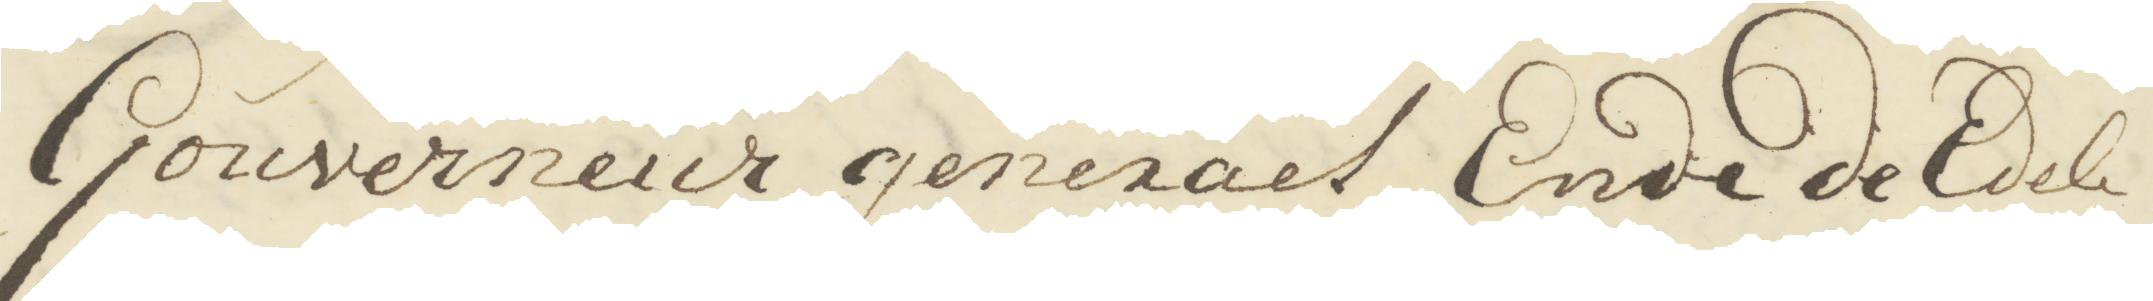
Gouverneur generael Ende de Edele
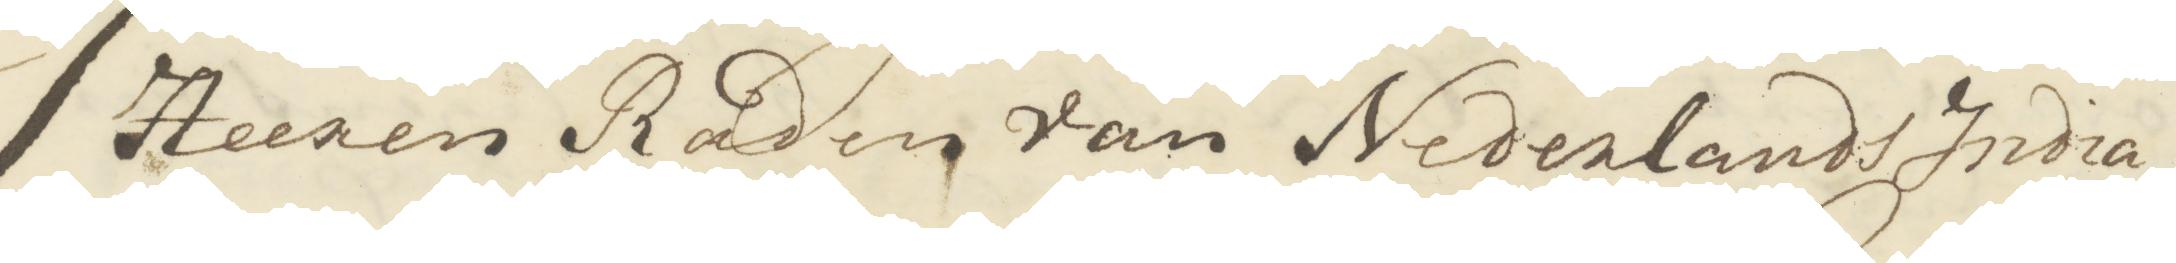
Heeren Raden van Nederlands India
